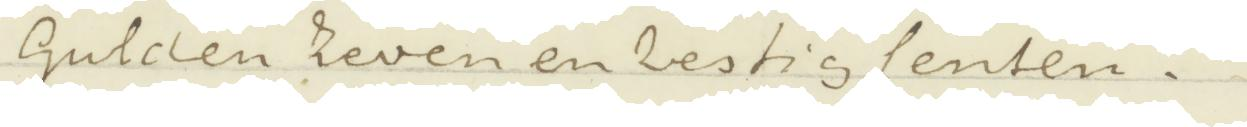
Gulden Zeven en Zestig Centen -
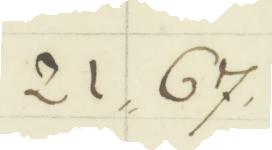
21 „ 67,
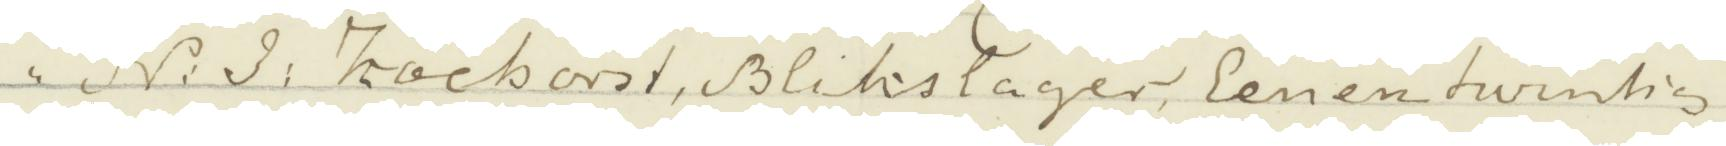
„ N: I: Koehorst, Blikslager, Een en twintig
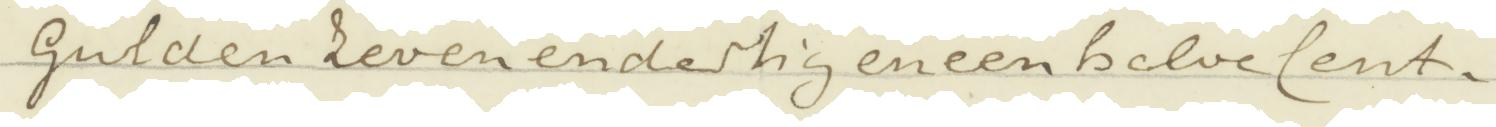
Gulden Zeven en dertig en een halve Cent -
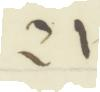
21 „
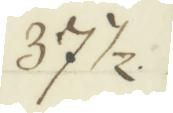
37½.
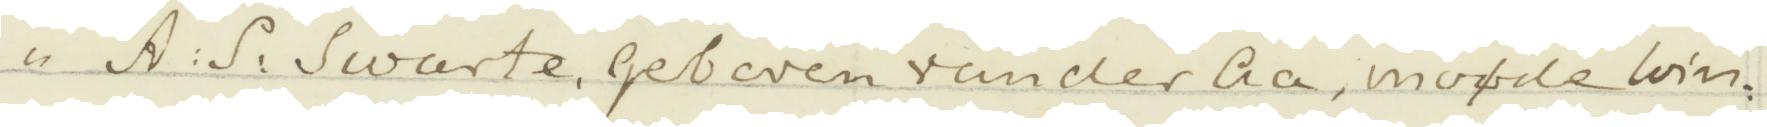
„ A: S: Swarte, geboren van der Aa moode win„
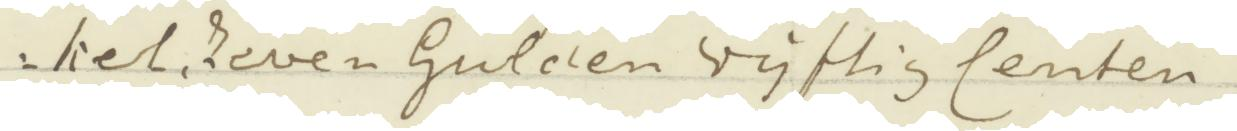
=kel, Zeven Gulden vijftig Centen
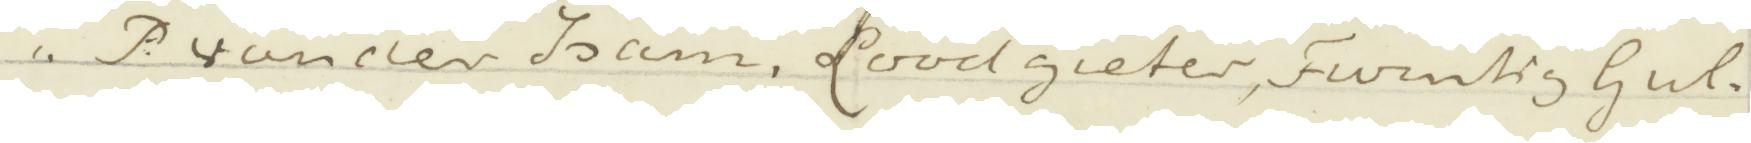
„ P: van der Ham, Loodgieter, Twintig Gul„
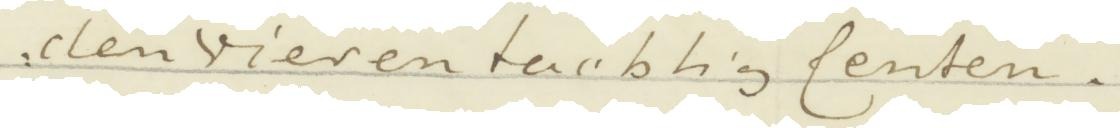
„den vier en tachtig Centen -
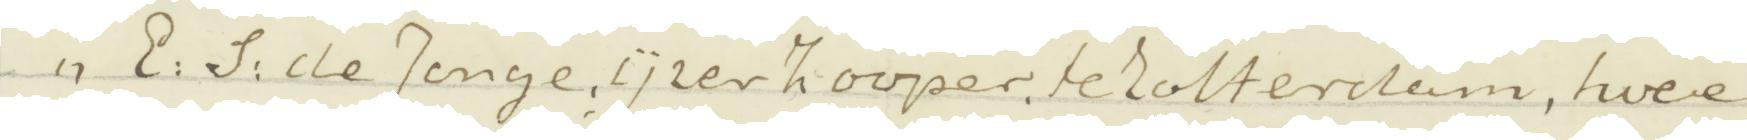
„ E: S: de Jonge ijzerkooper te Rotterdam, twee
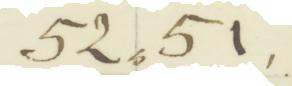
52 „ 51 ,
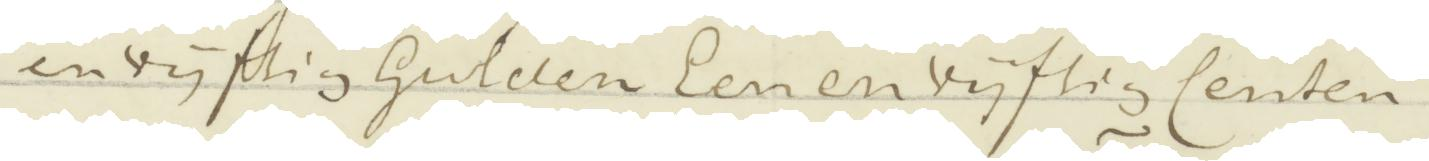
en vijftig Gulden Een en vijftig Centen
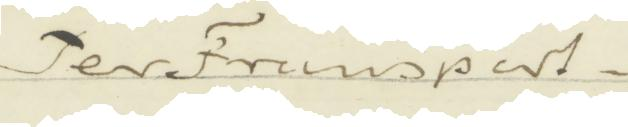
Per Transport -
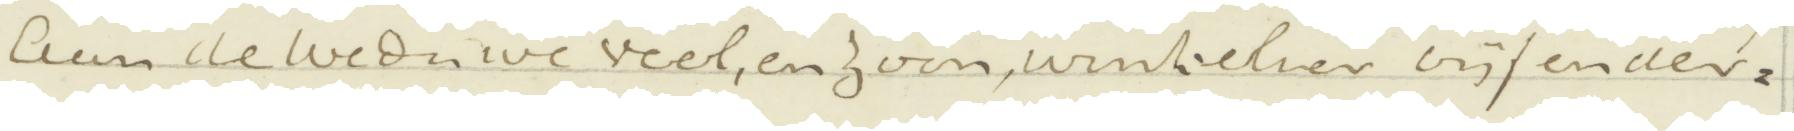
Aan de Weduwe Veel, en Zoon, winkelier vijf en der„
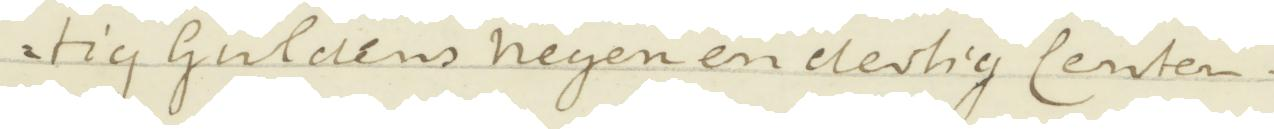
=tig Guldens negen en dertig Centen
